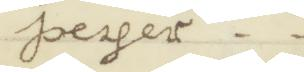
peper -
